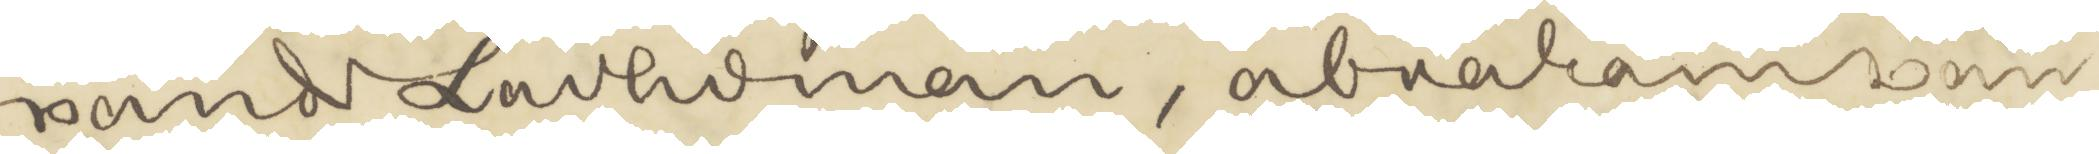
van de Laekeman, abraham van
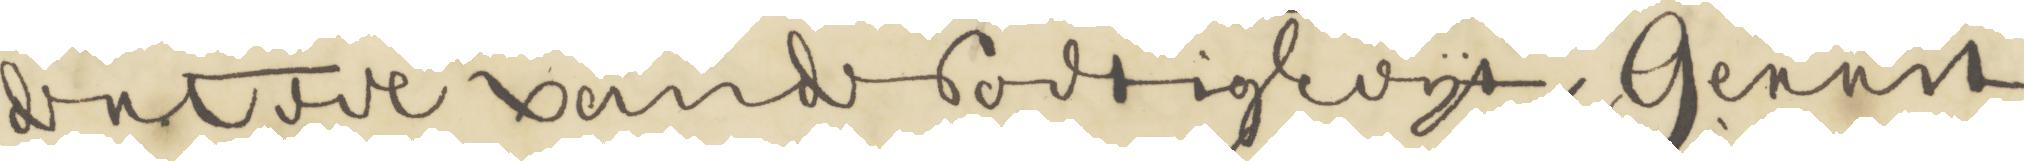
der ceel van de soetigheijt, Gerrit
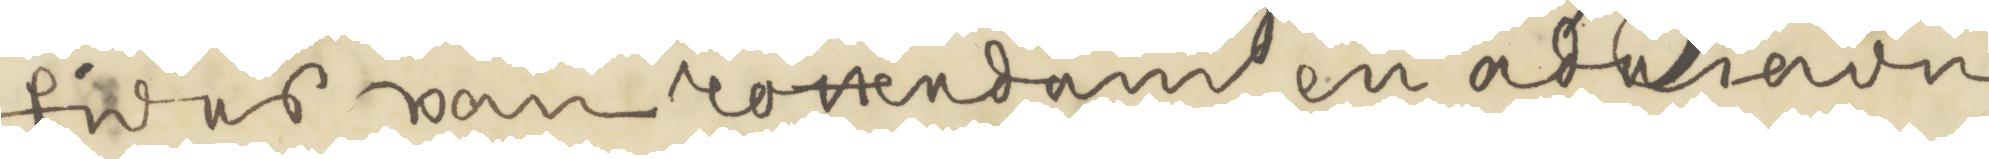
fiers van rotterdam en adriaen
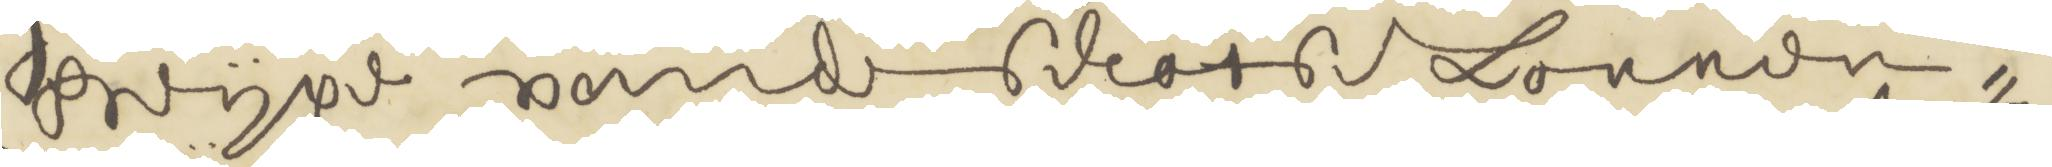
heijpe vande schotse Lorren„
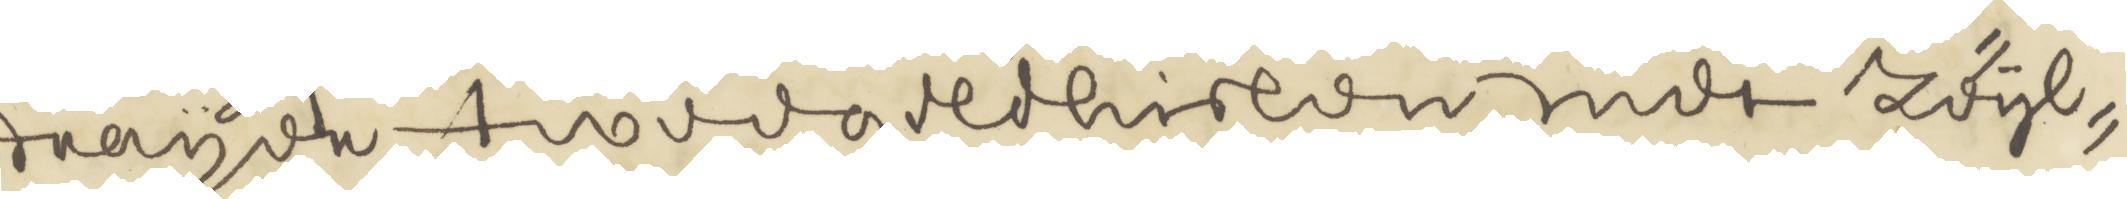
draijer twee geldkisten met zeijl„
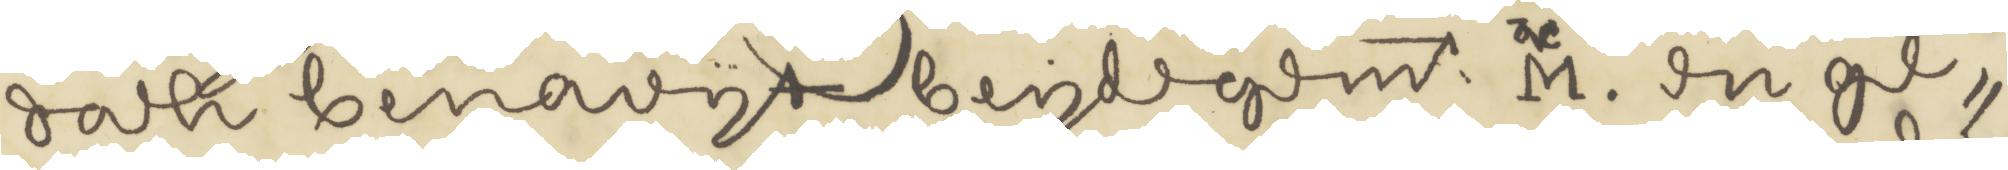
doek benaeijt beijde gem:t M. en ge„
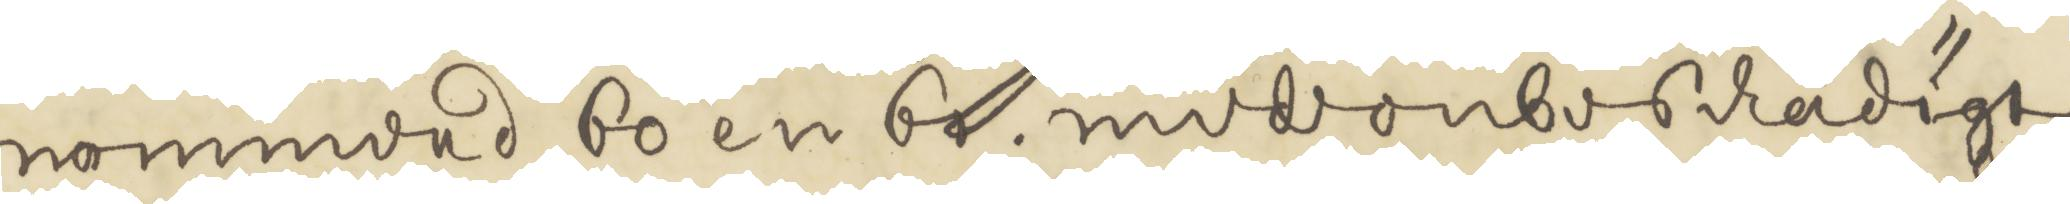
nommerd 60 en 61. mede onbeschadigt
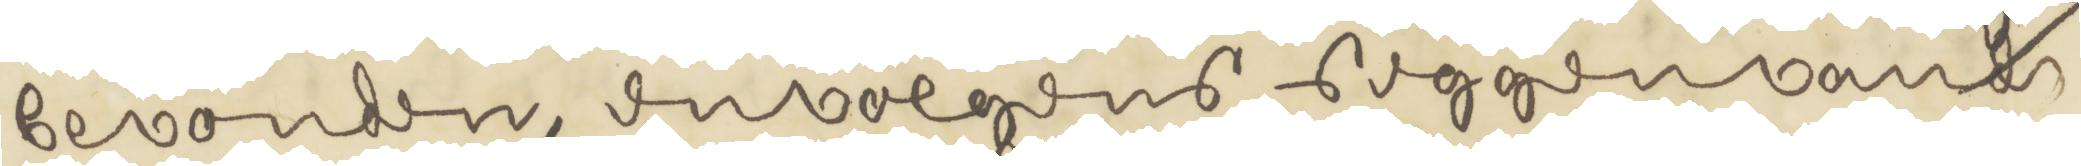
bevonden, en volgens seggen vande
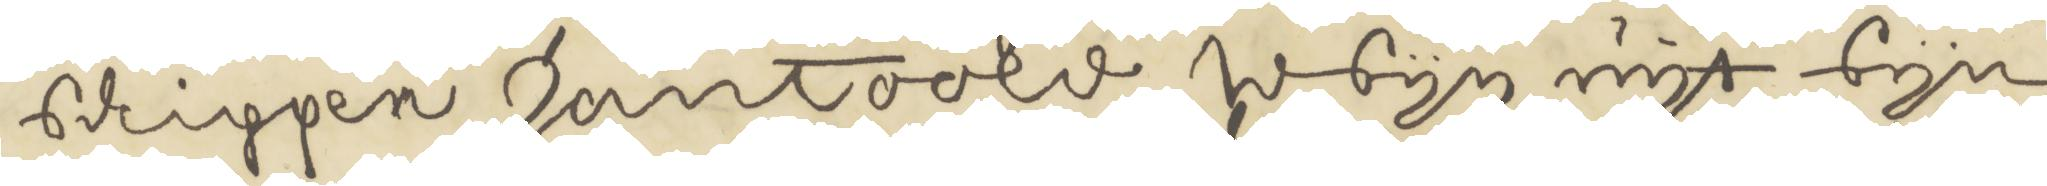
schipper Jan Coole te sijn uijt sijn
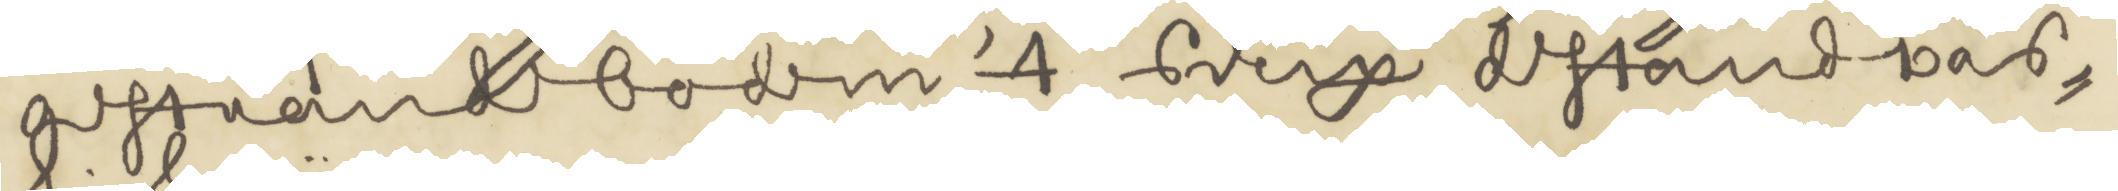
gestrande bodem ’t schip de standvas„
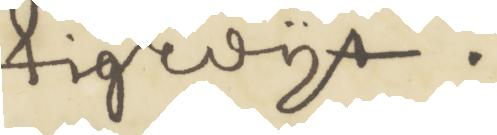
tigheijt.
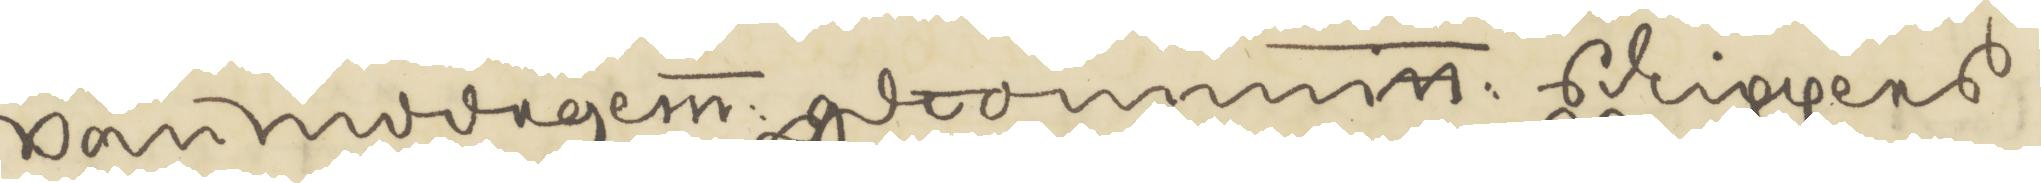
van meergem: gecommitt: schippers
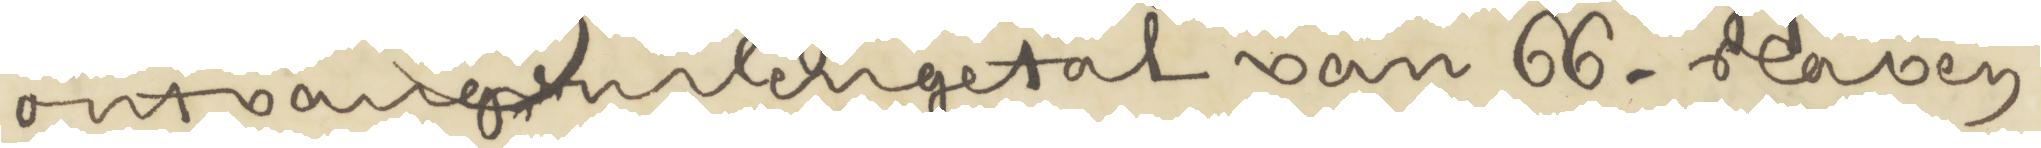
ontvangen Een getal van 66. slaven
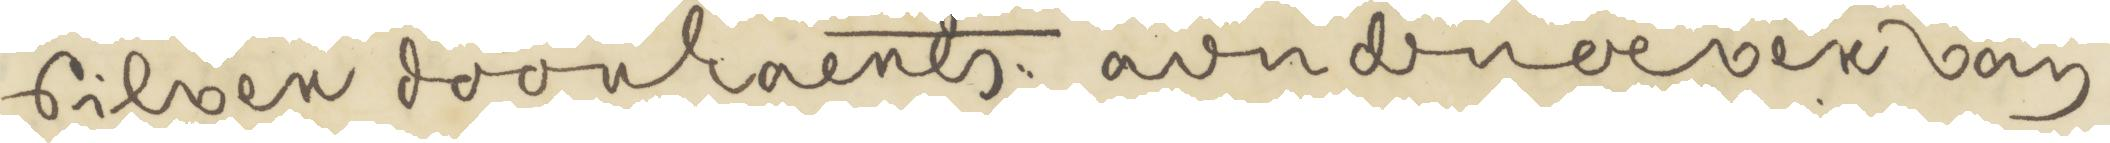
silver door haerl: aen den oever van
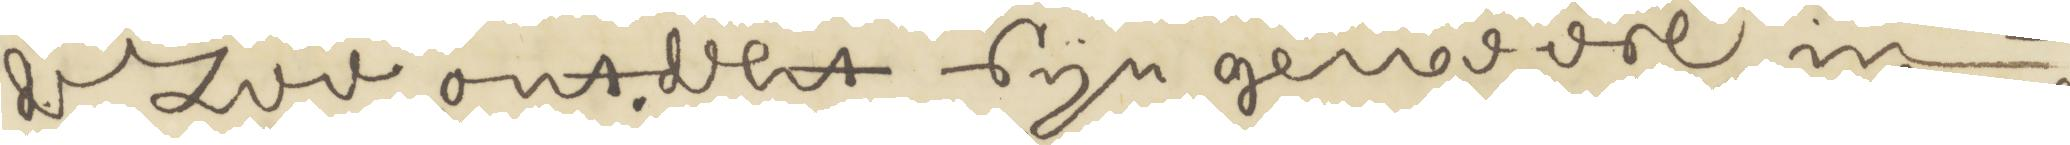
de zee ontdekt sijn geweest in
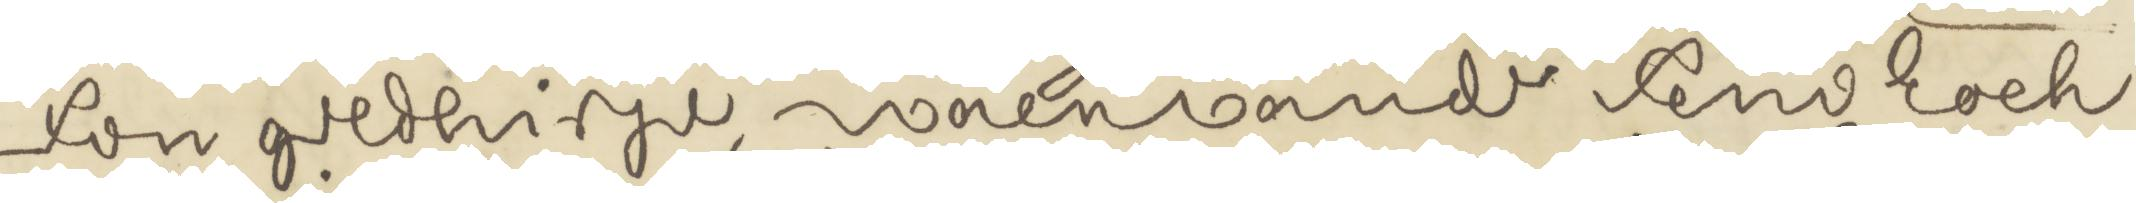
Een geldkisje, waer vande Eene hoek
